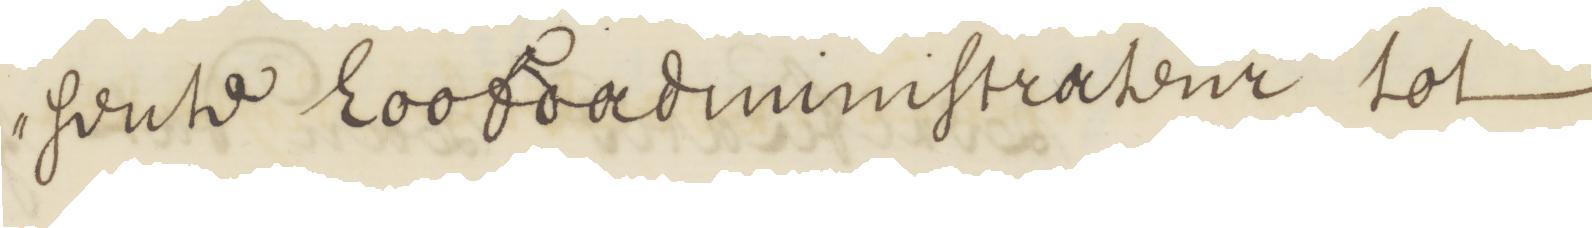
„sente hoofdadministrateur tot
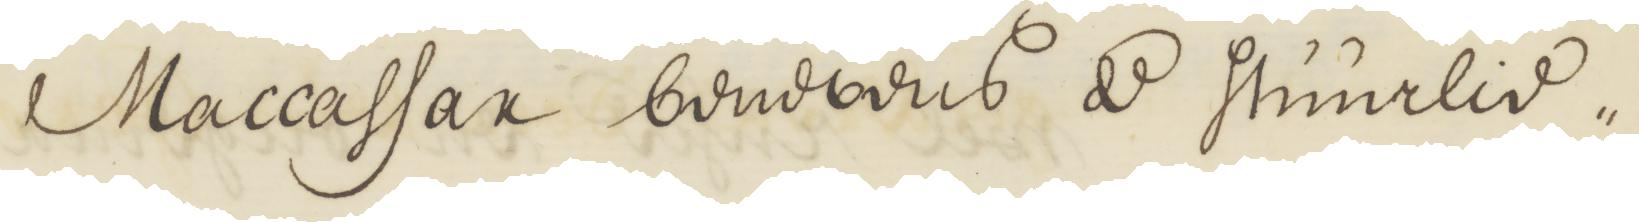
Maccassar benevens de stuurlie„
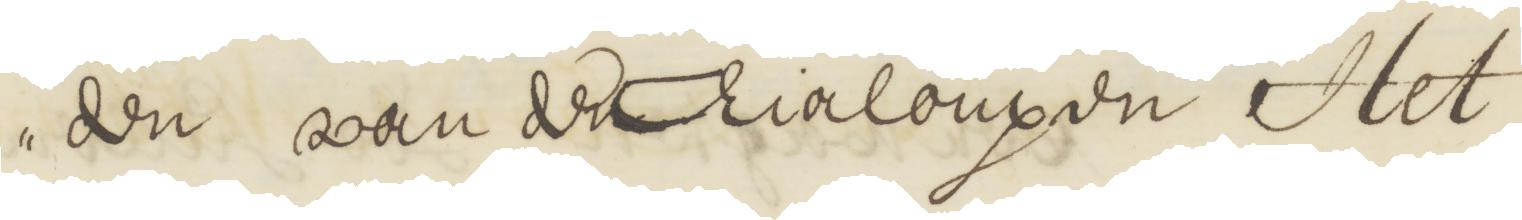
„den van de Chialoupen Het
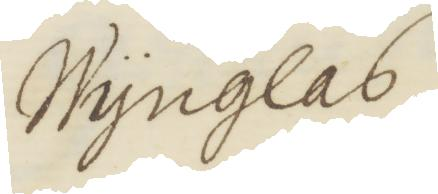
Wijnglas
